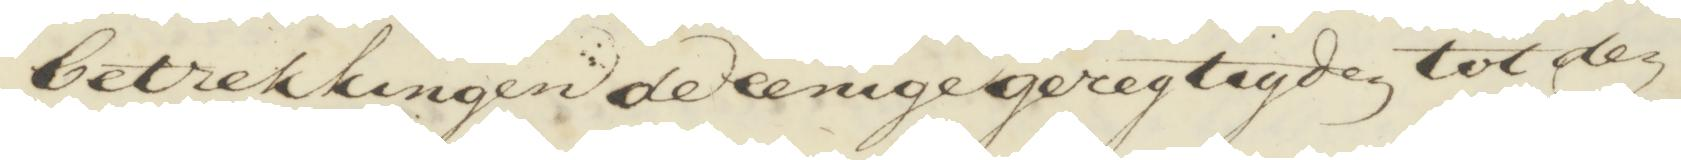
betrekkingen de eenige geregtigden tot den
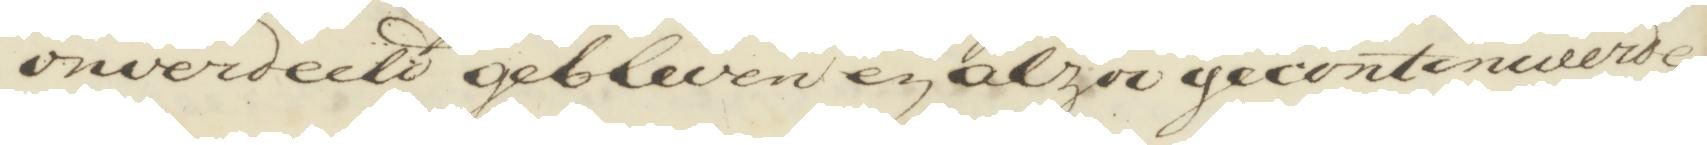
onverdeeld gebleven en alzoo gecontinueerden
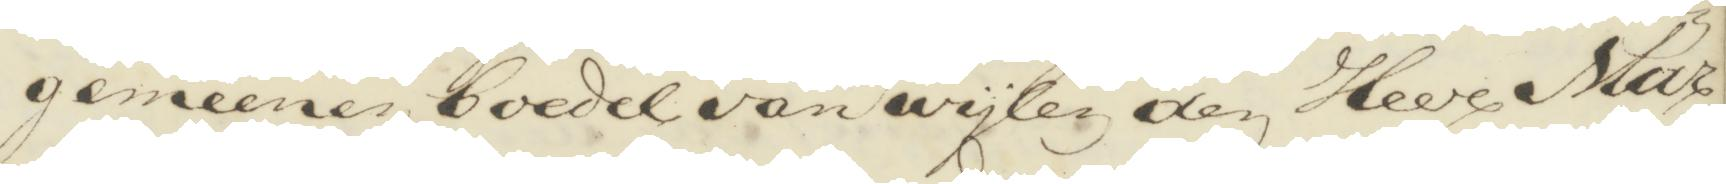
gemeenen boedel van wijlen den Heer Mar
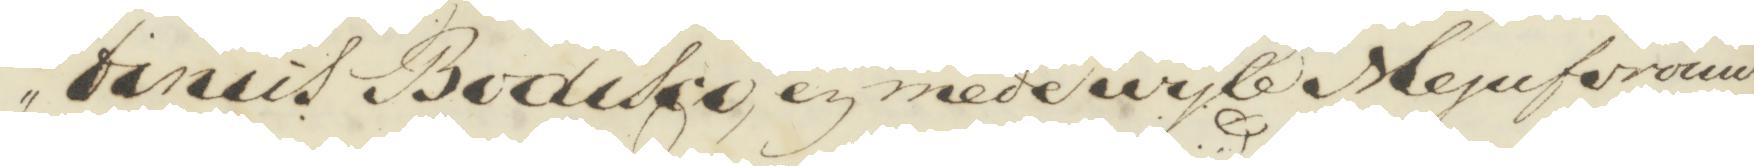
„tinus Bodisco, en mede wijle Mejufvrouw
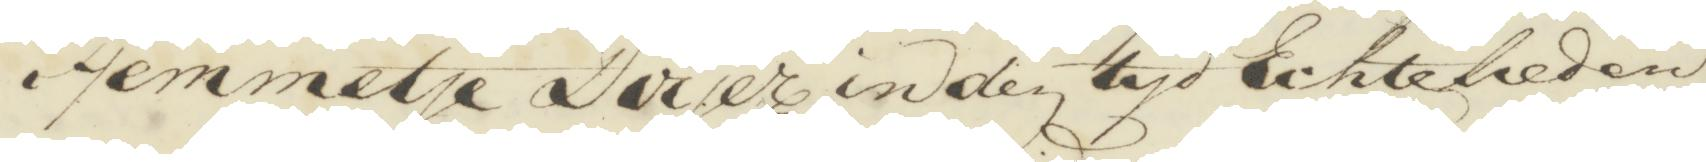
Tsemmetje Doyer, in den tijd Echtelieden,
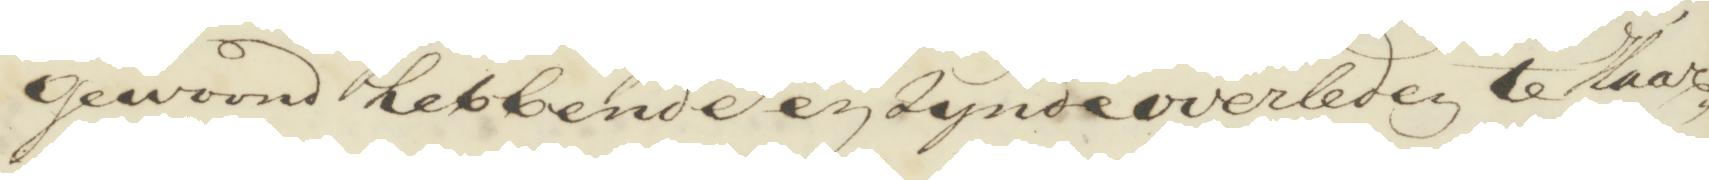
gewoond hebbende en zynde overleden te Haar„
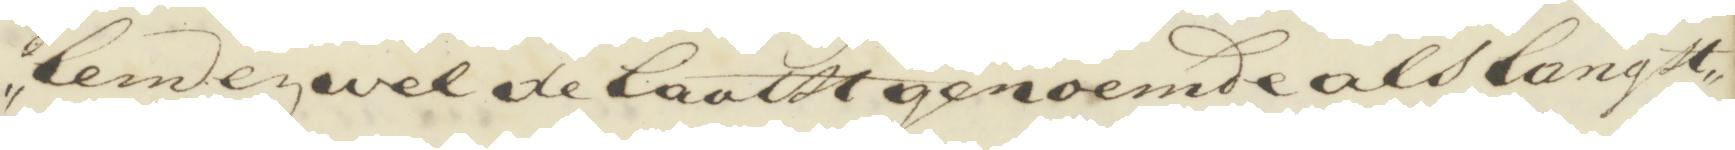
„lem en wel de laatst genoemde als langst„
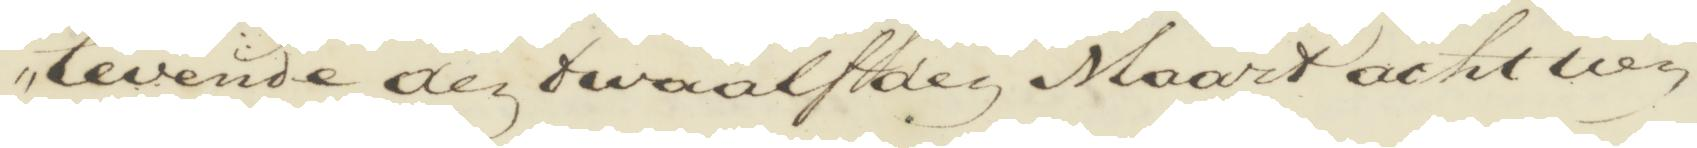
„levende den twaalfden Maart achttien
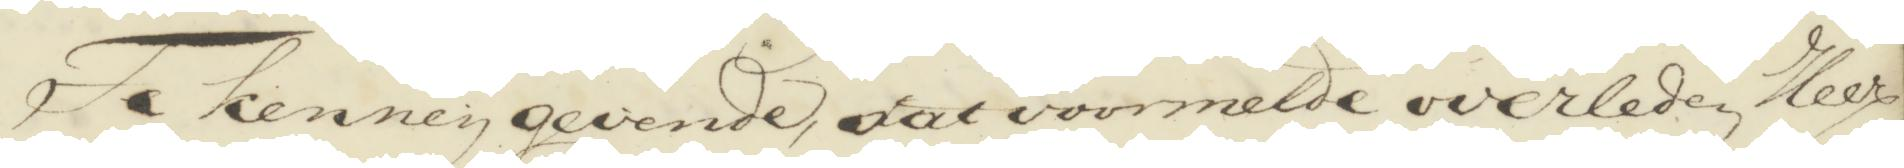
Te kennen gevende, dat voormelde overleden Heer
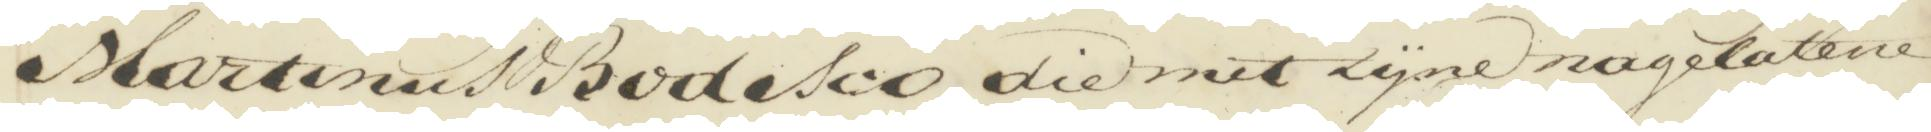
Martinus Bodisco, die met zijne nagelatene
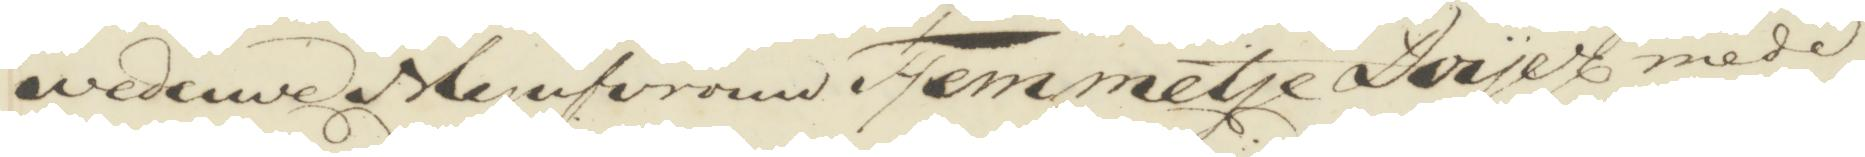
weduwe Mejufvrouw Tsemmetje Doijer mede
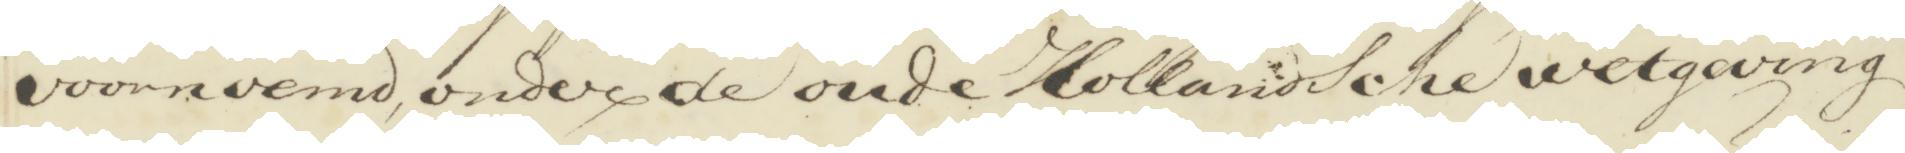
voornoemd, onder de oude Hollandsche wetgeving
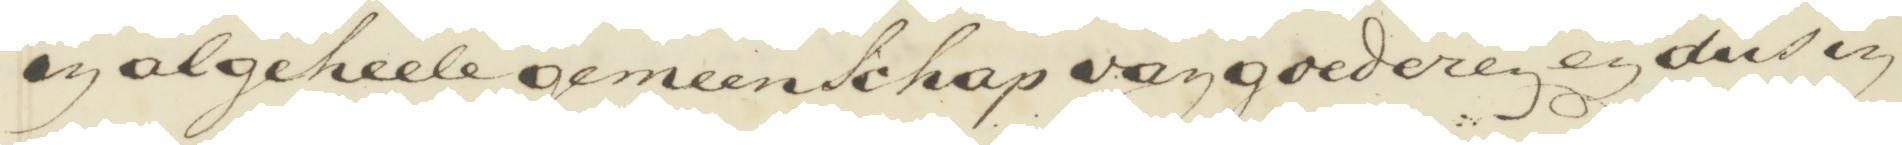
en algeheele gemeenschap van goederen en dus in
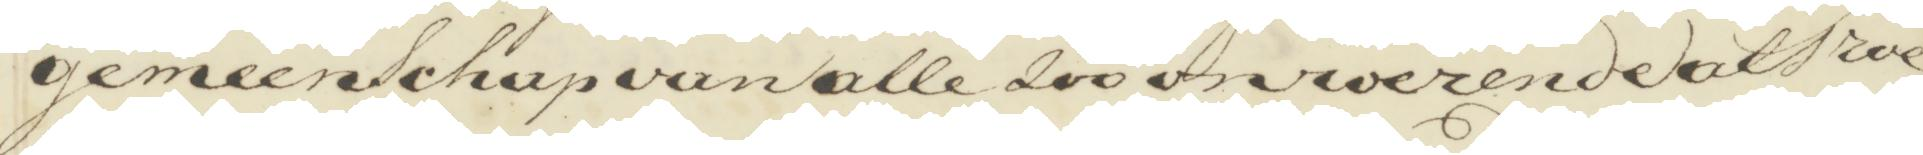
gemeenschap van alle zoo onroerende als roe
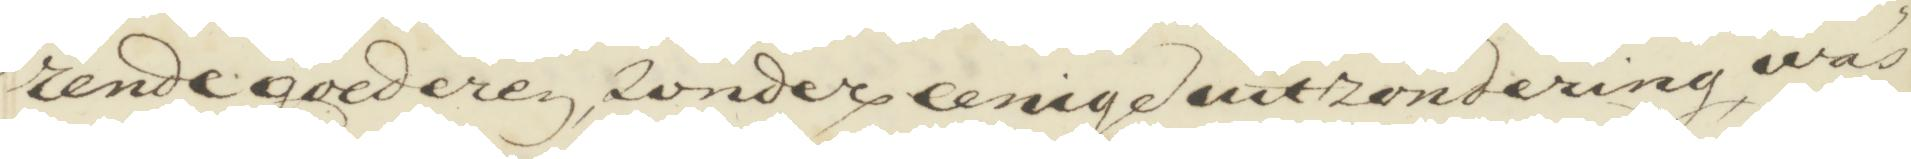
rende goederen, zonder eenige uitzondering, was
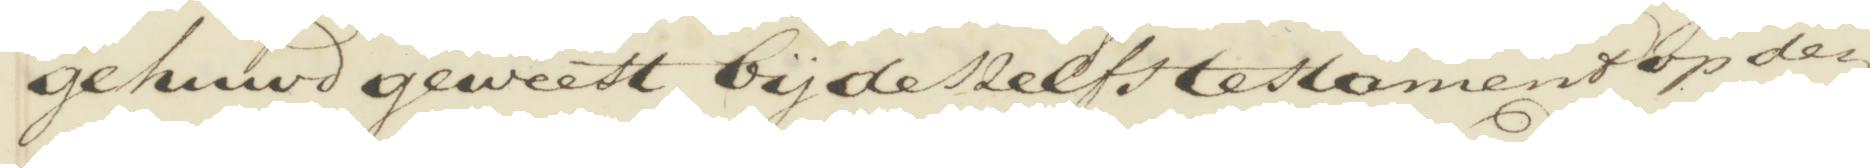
gehuwd geweest, bij deszelfs testament op den
